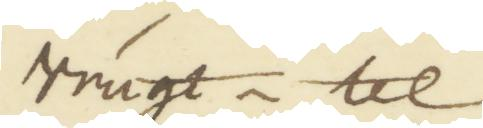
vrugt – tel
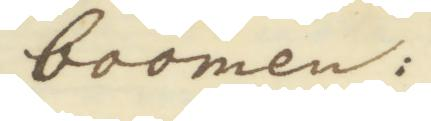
boomen:
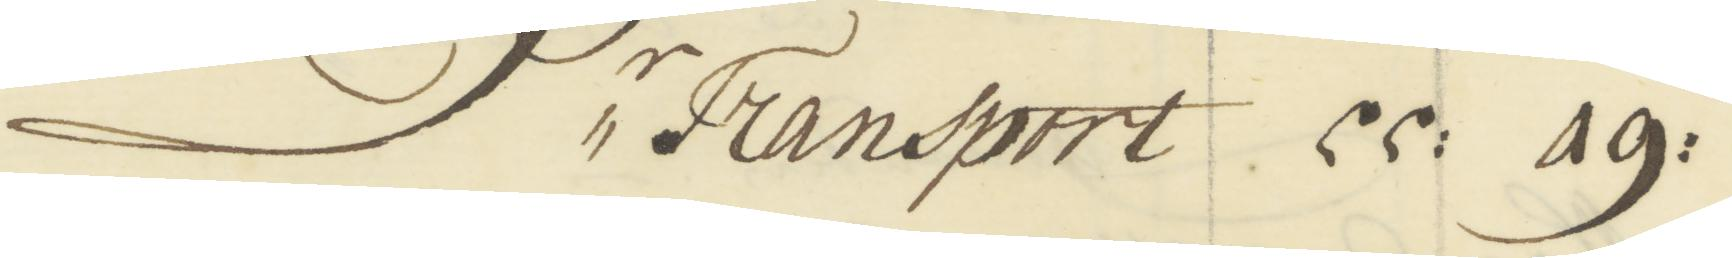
P„r Transport 55: 49:
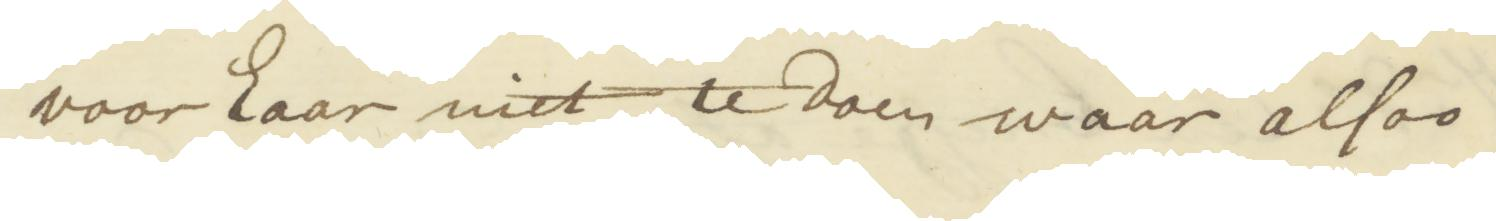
voor haar niet te doen waar alsoo
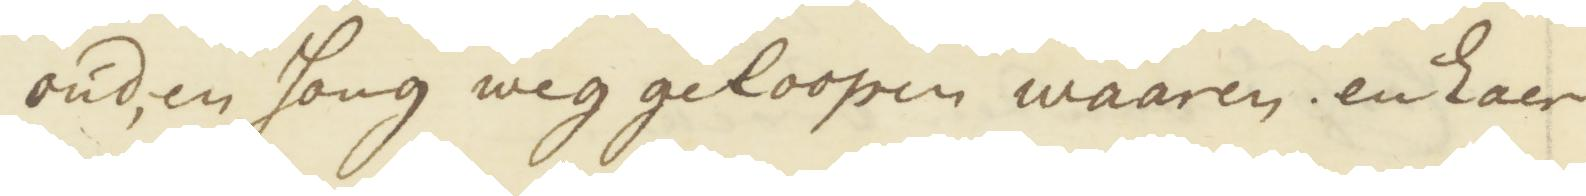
oud, en Jong weg geloopen waaren. en haer
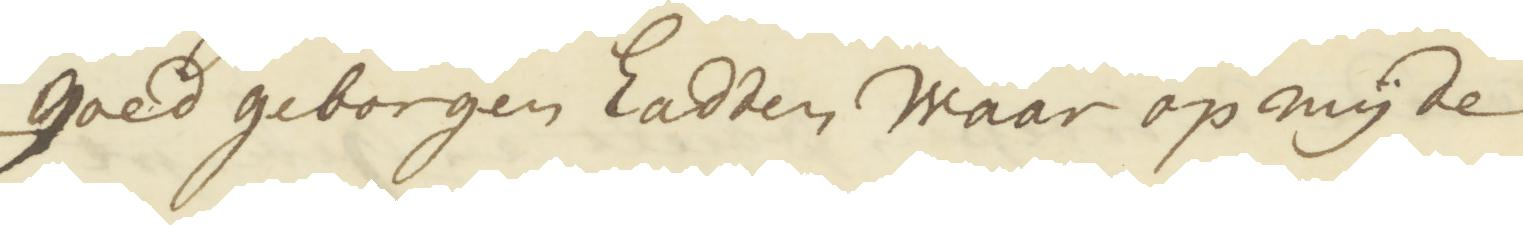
goed geborgen hadden waar op mij de
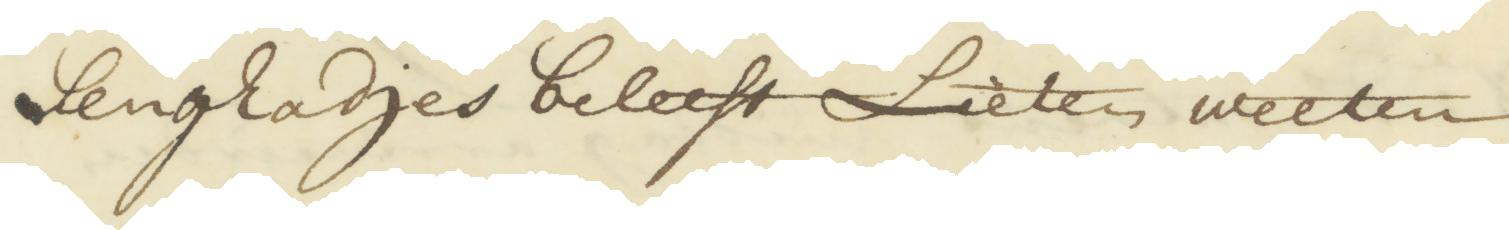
senghadjes beleeft Lieten weeten
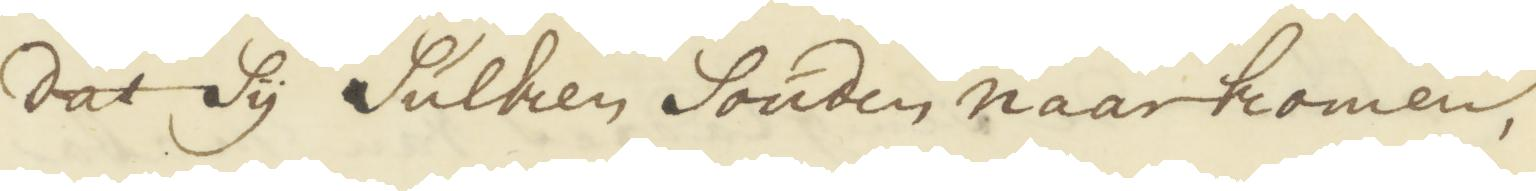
dat sij sulken souden naarkomen,
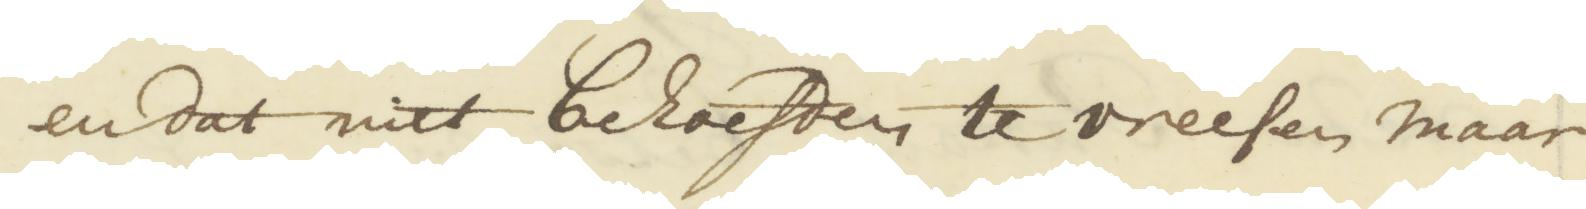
en dat niet behoefden te vreesen maar
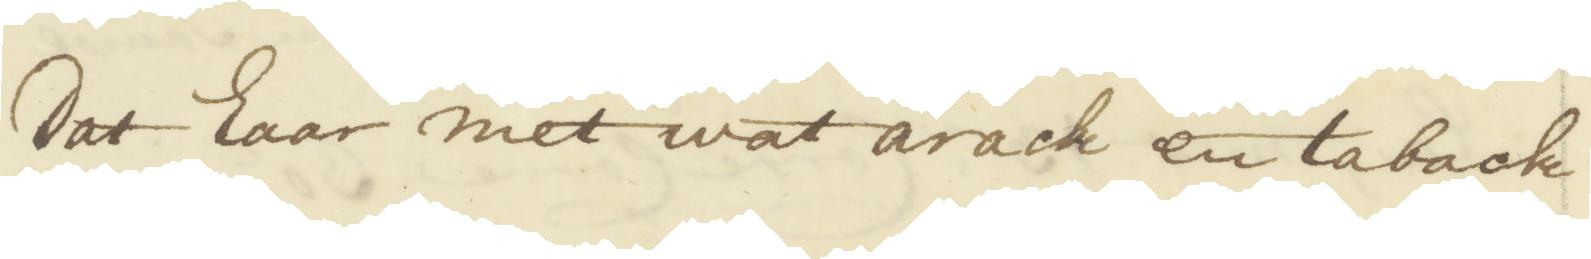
dat haar met wat arack en taback
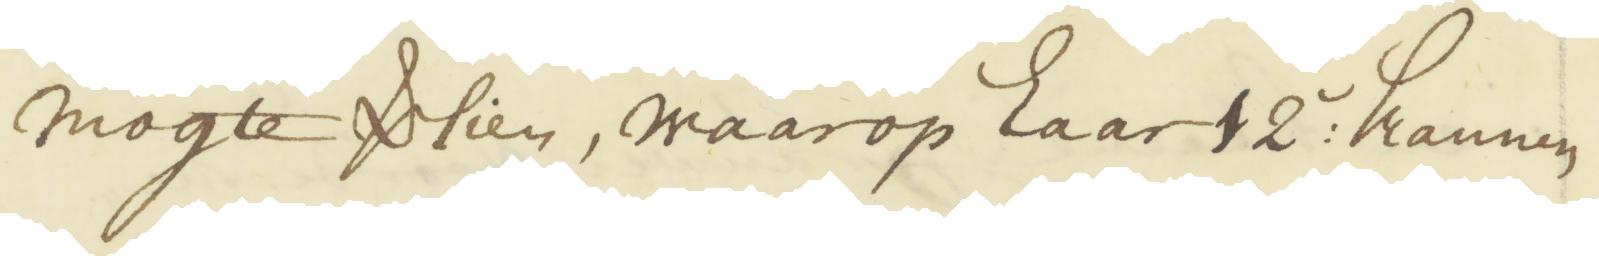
mogte versien, waarop haar 12:' kannen
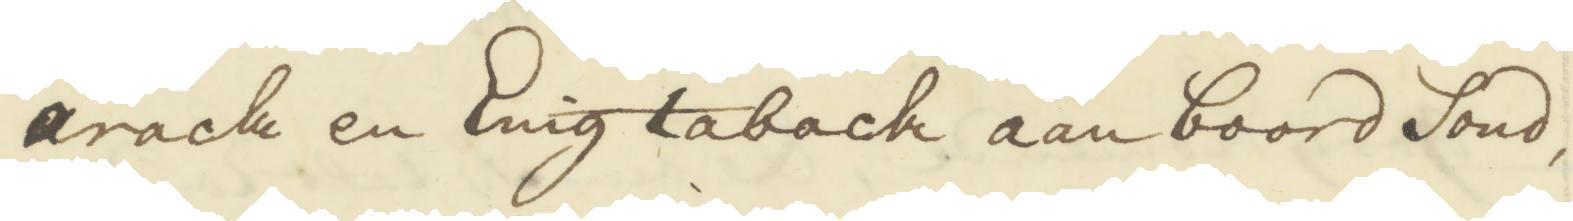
arack en Enig taback aan boord sond,
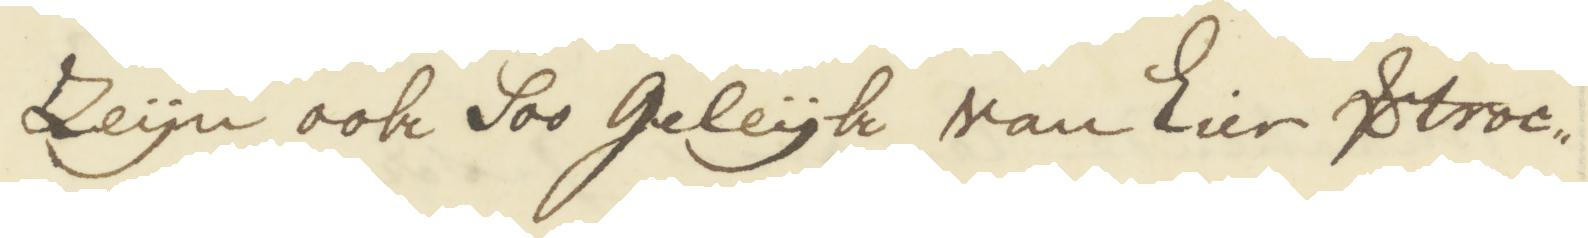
zeijn ook soo geleijk van hier vertroc„
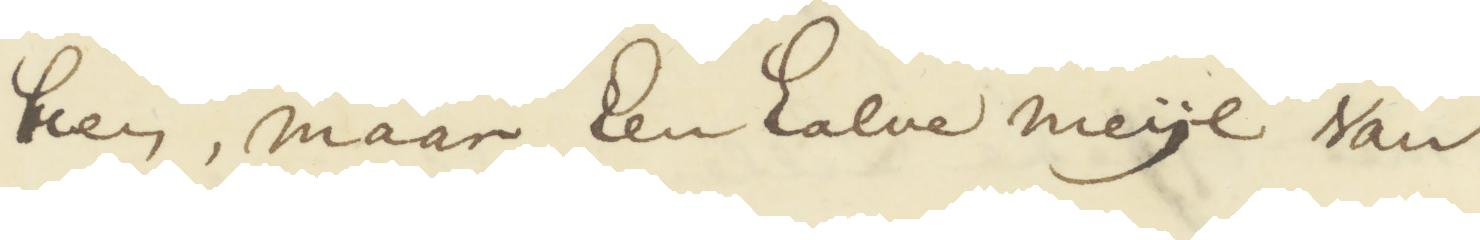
ken, maar Een halve meijl van
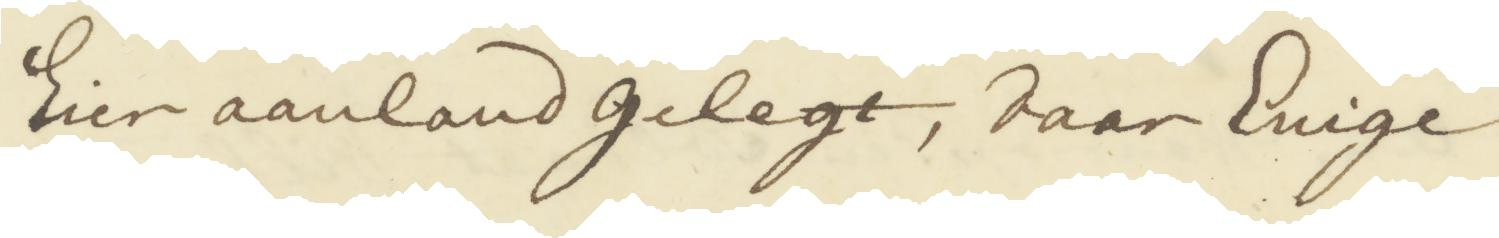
hier aanland gelegt, daar Enige
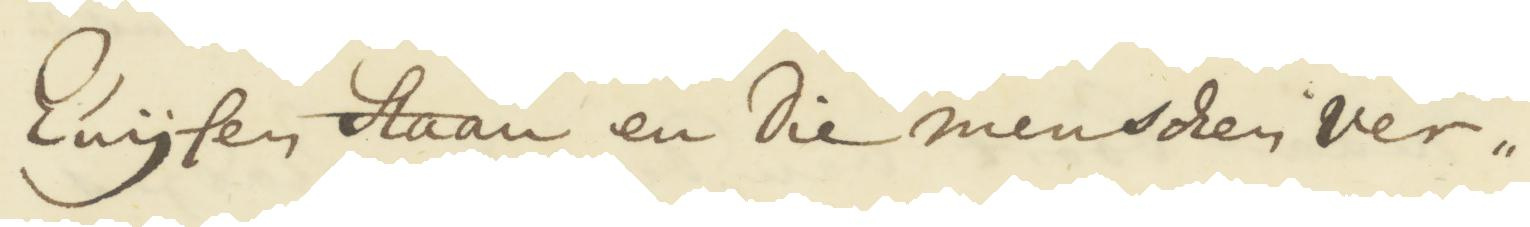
huijsen staan en die menschen ver„
